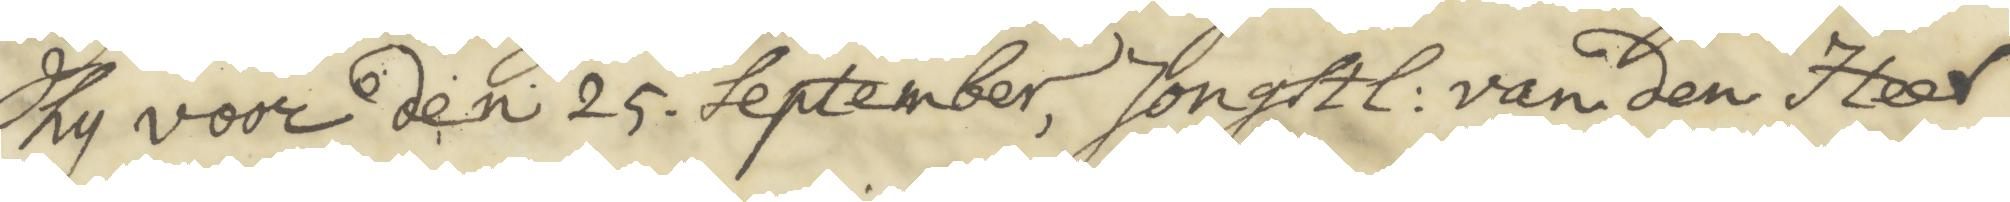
hy voor den 25. september, Jongstl: van den Heer
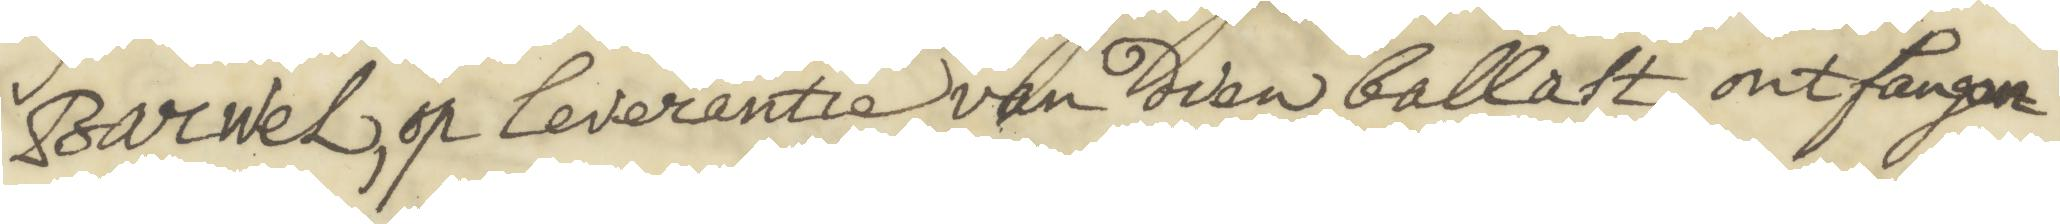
Barwel, op leverantie van dien ballast, ontfangen
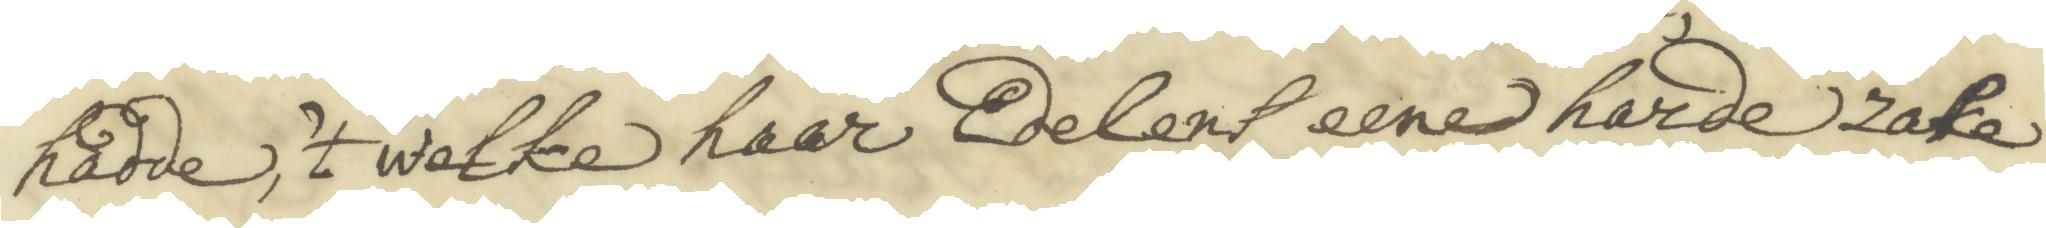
hadde, 't welke haar Edelens eene harde zake
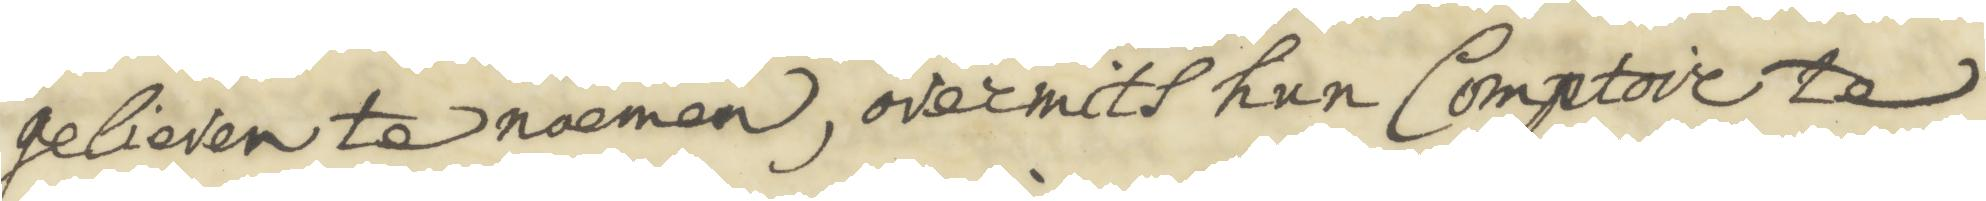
gelieven te noemen, overmits hun Comptoir te
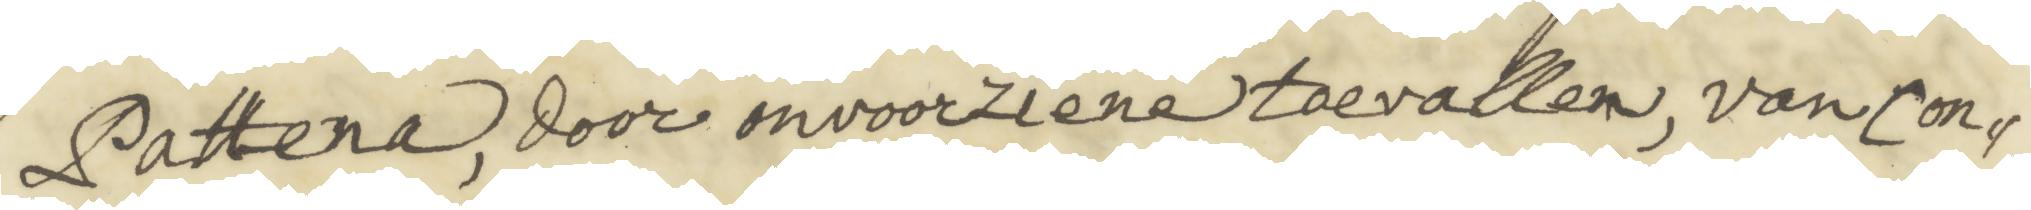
Pattena, door onvoorziene toevallen, van Con„
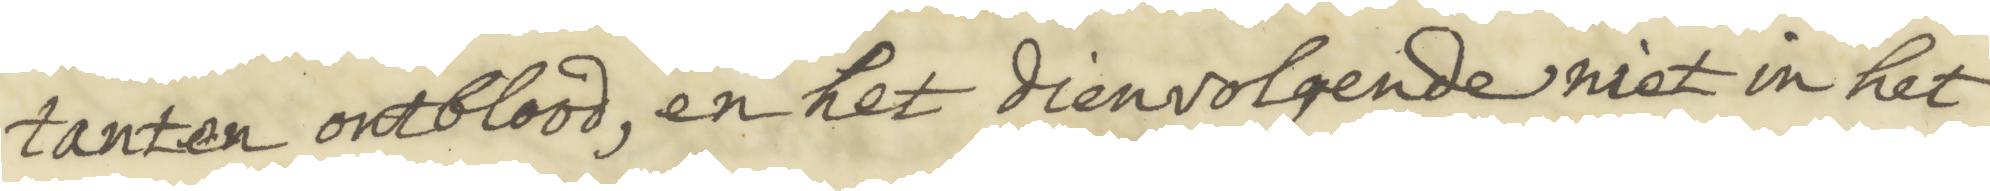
tanten ontblood, en het dienvolgende niet in het
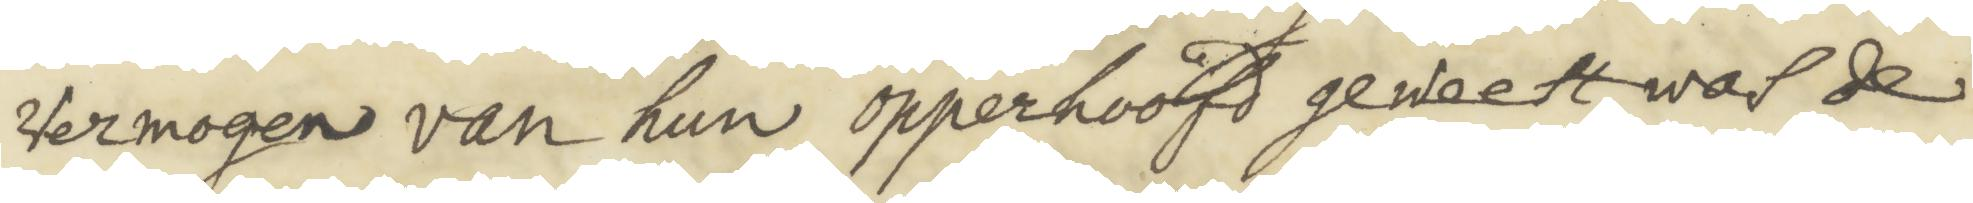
vermogen van hun opperhoofd geweest was de
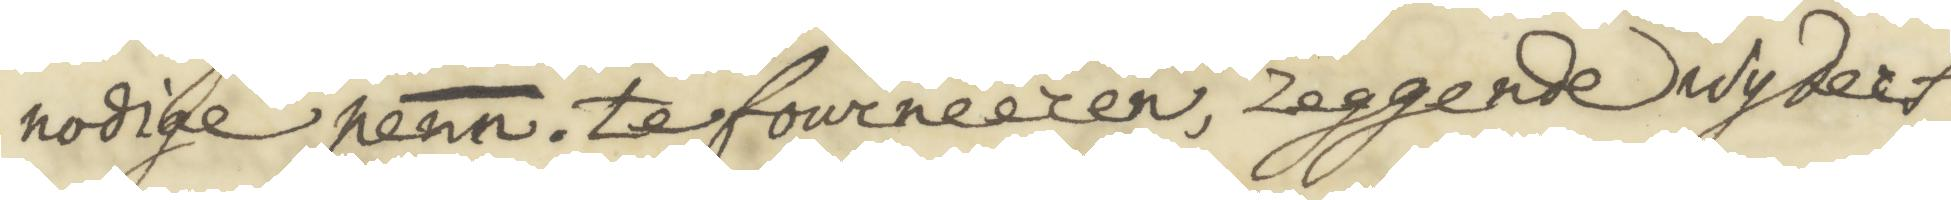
nodige penn. te fourneeren, zeggende wyders
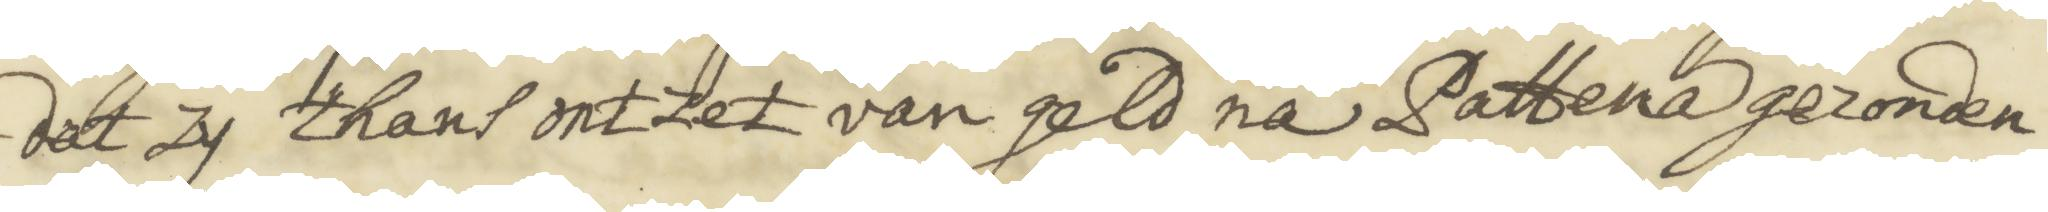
dat zy thans ontzet van geld na Pattena gezonden
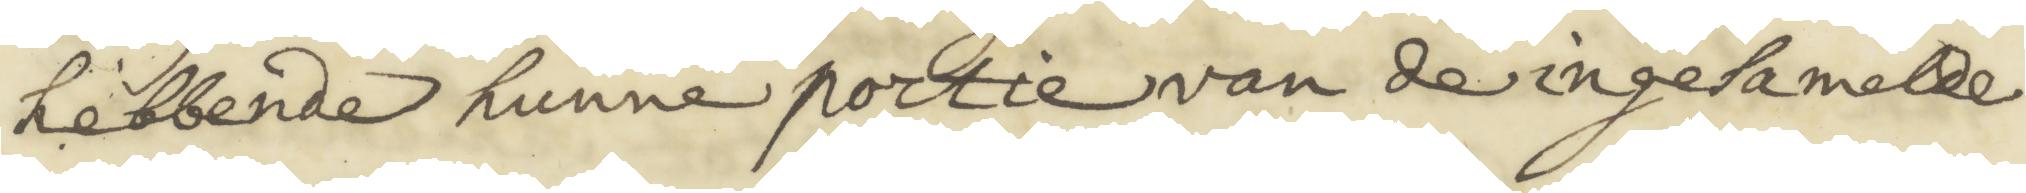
hebbende hunne portie van de ingesamelde
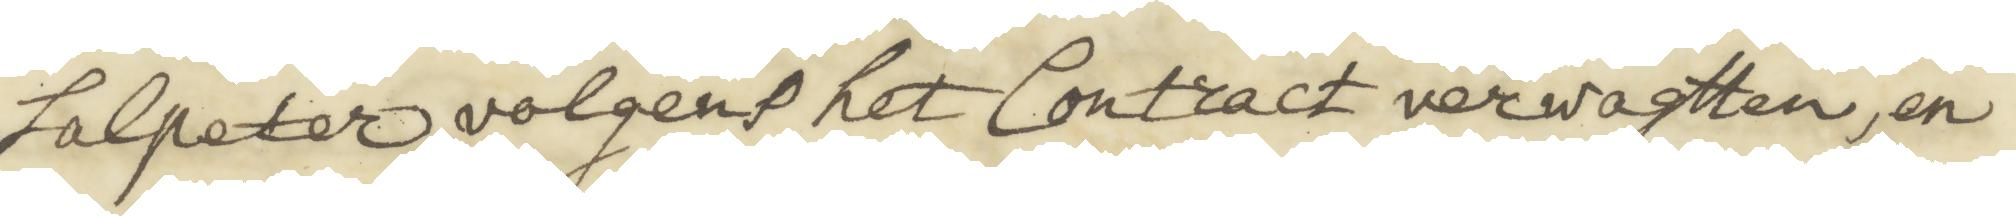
salpeter volgens het Contract verwagtten, en
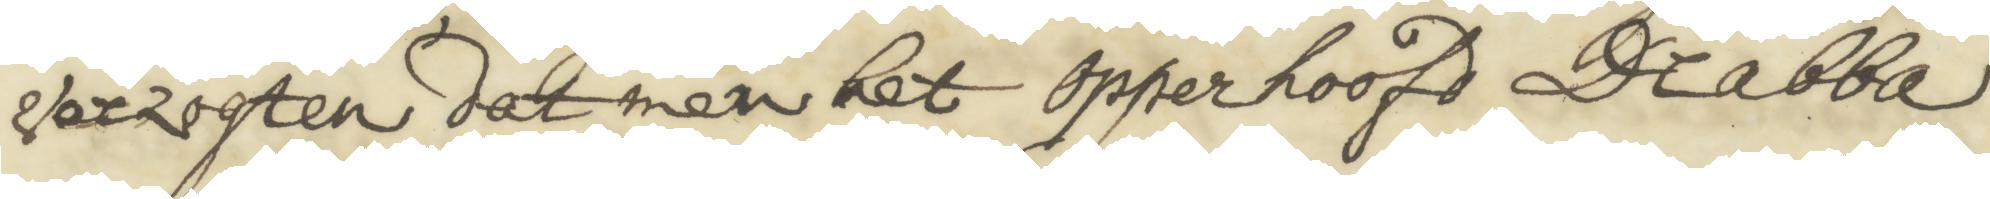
verzogten dat men het opperhoofd Drabba
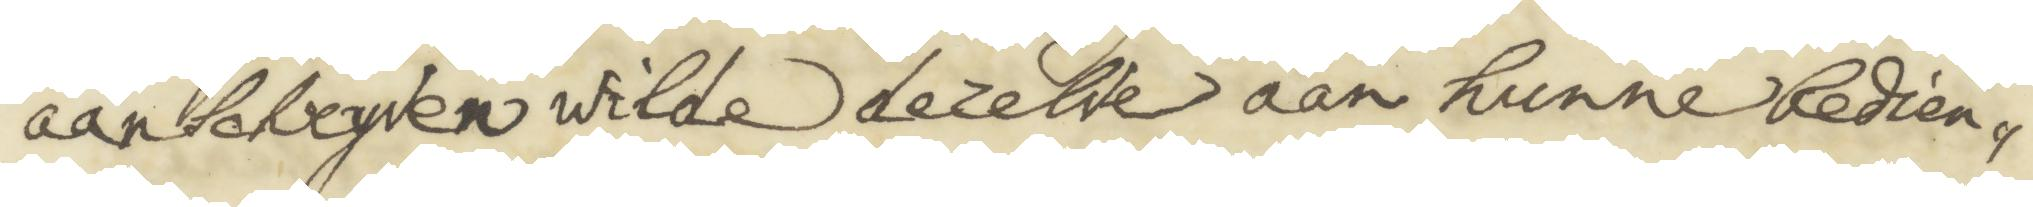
aan schryven wilde dezelve aan hunne bedien„
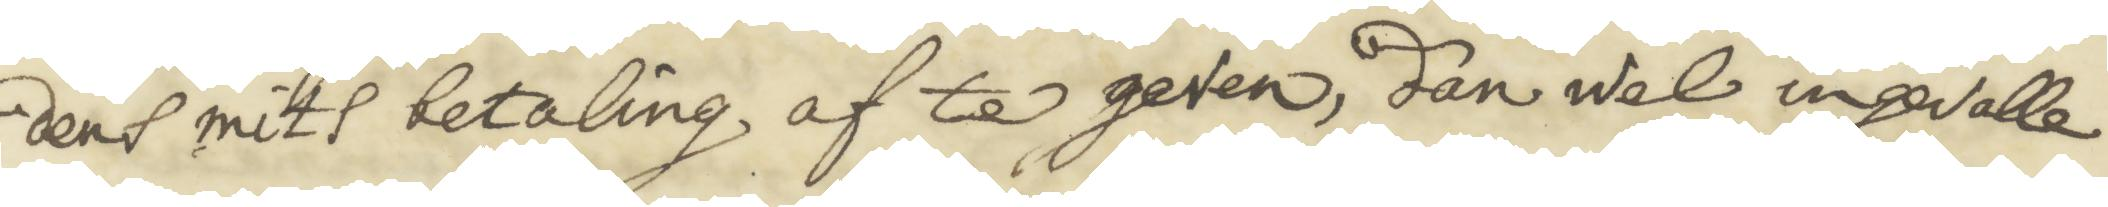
dens mits betaling af te geven, dan wel ingevalle
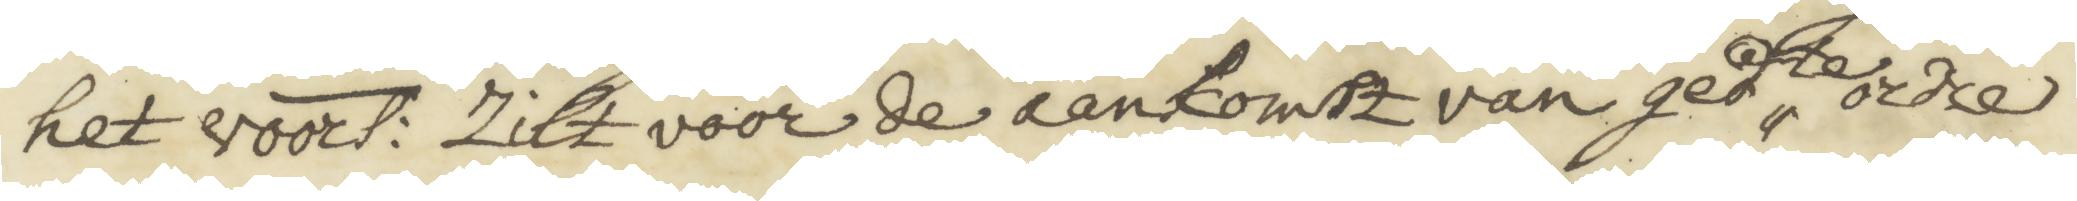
het voors: zilt voor de aankomst van ged„te ordre
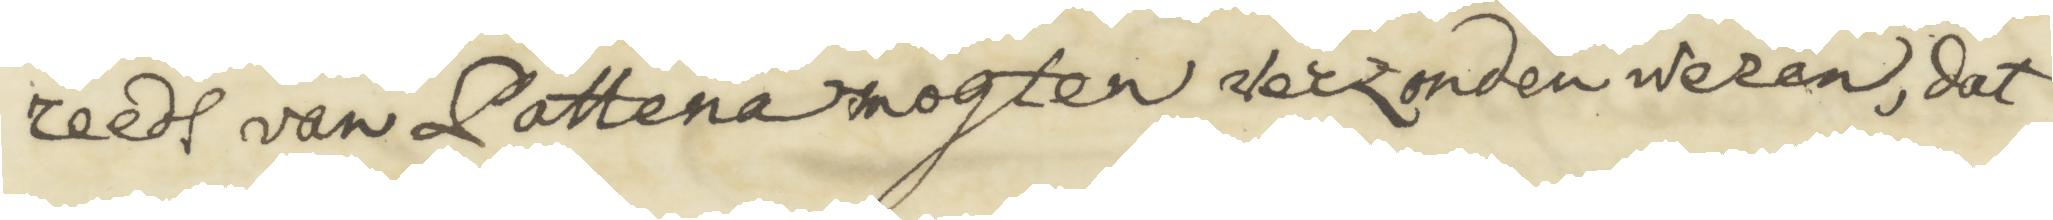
reeds van Pattena mogten verzonden wezen, dat
